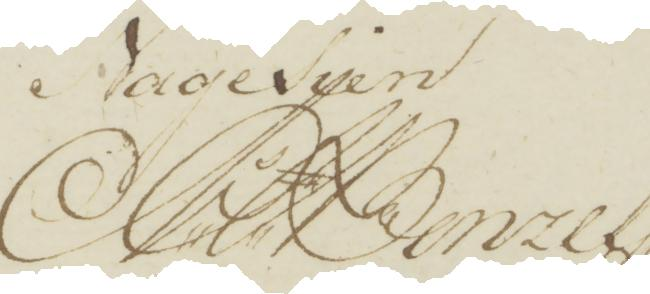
N„s C„k Benzel
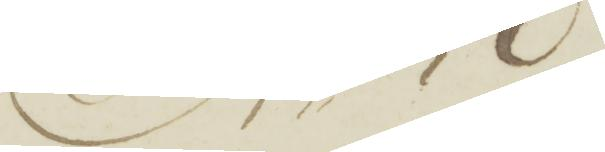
N„o 16
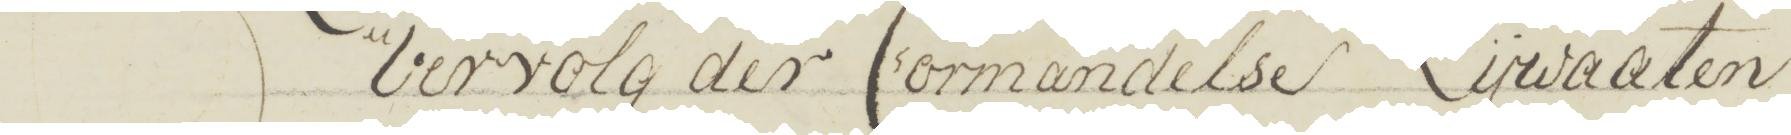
Vervolg der Cormandelse Lijwaaten
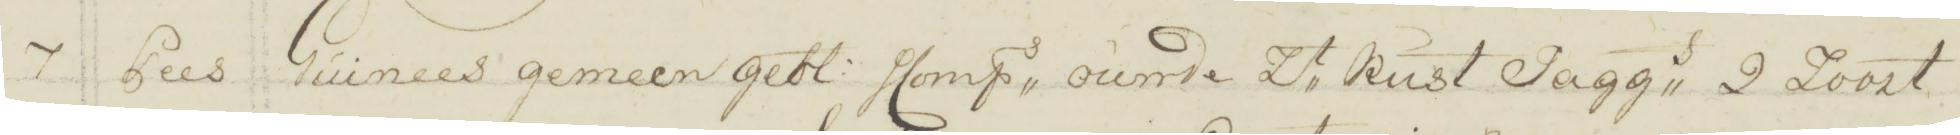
7 Pees Guinees gemeen gebl: sComp„s ouwde Z„t Rust Iagg„s 2 zoort
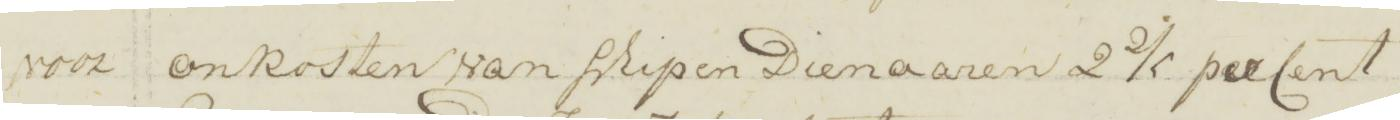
voor onkosten van schip en Dienaaren 2 2/5 percent
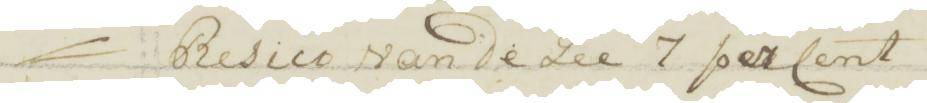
= Resico van de zee 7 percent
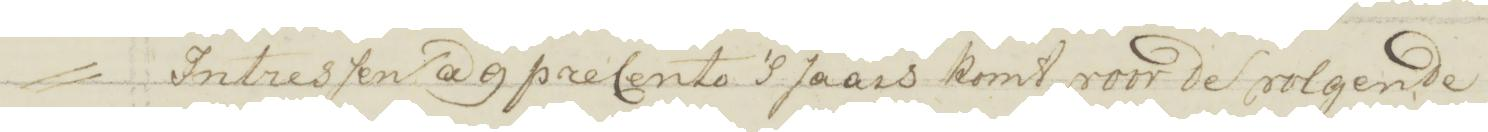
= Intressen @ 9 precento 's jaars komt voor de volgende
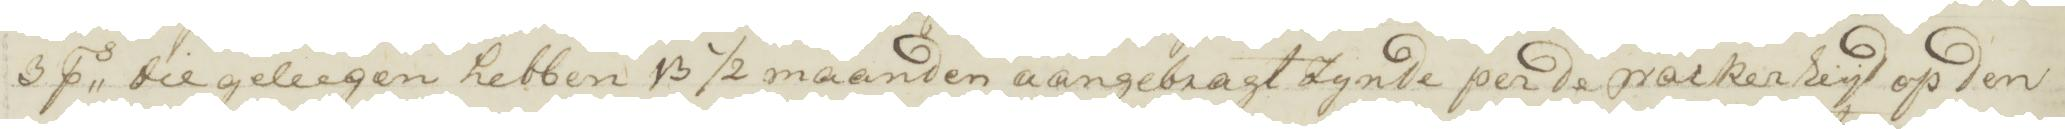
3 p„s die geleegen hebben 13½ maanden aangebragt zynde per de wackerheijd op den
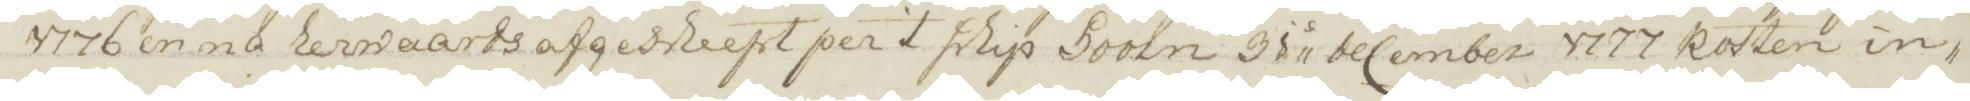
1776 en na herwaarts afgescheept per 't schip hoorn 31„e december 1777 kosten in„
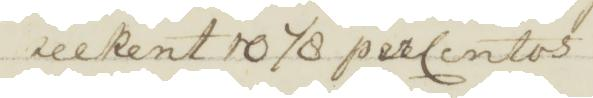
reekent 1078 percentos
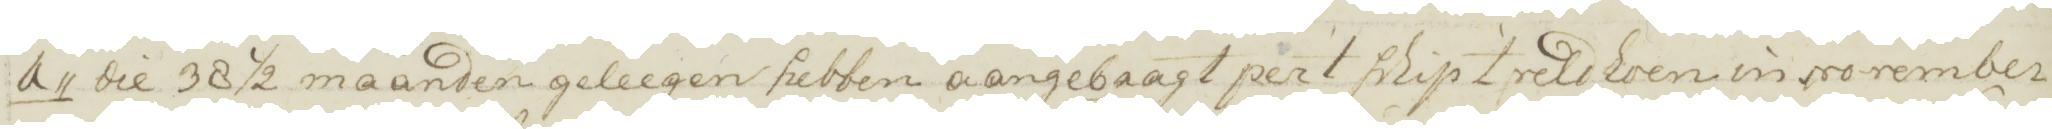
4„ die 38½ maanden geleegen hebben aangebragt per 't schip 't veld hoen in november
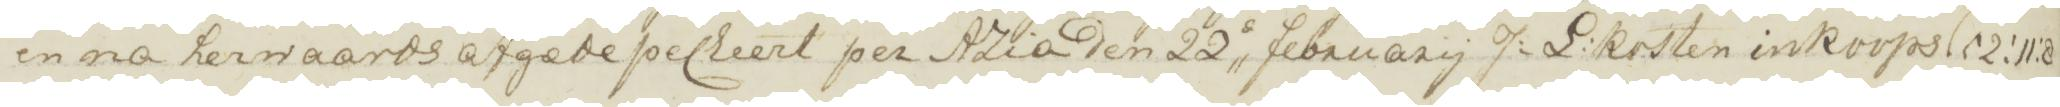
en na herwaards afgedepecheert per Azia den 22„e februarij J: L: kosten inkoops ƒ52:11:8
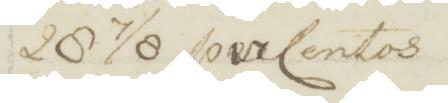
28 1/8 percentos
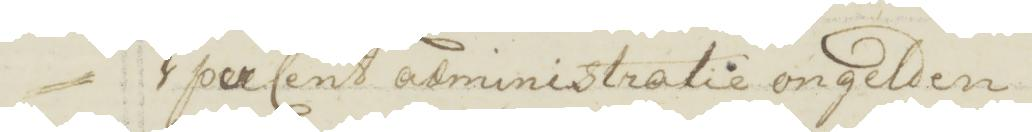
= 4 percent administratie ongelden
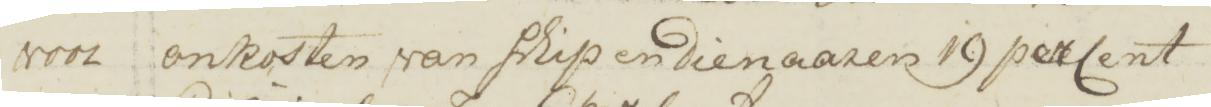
voor onkosten van schip en dienaaren 19 percent
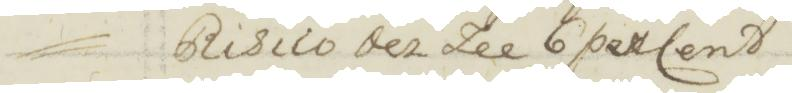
= Risico der zee 6 percent
